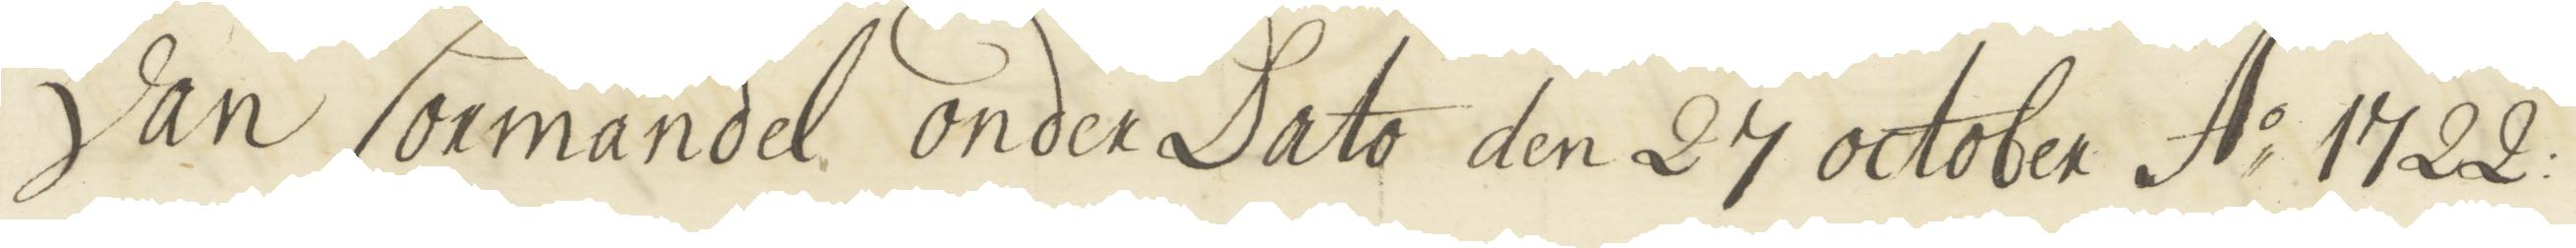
Van Cormandel onder Dato den 27 october A„o 1722:
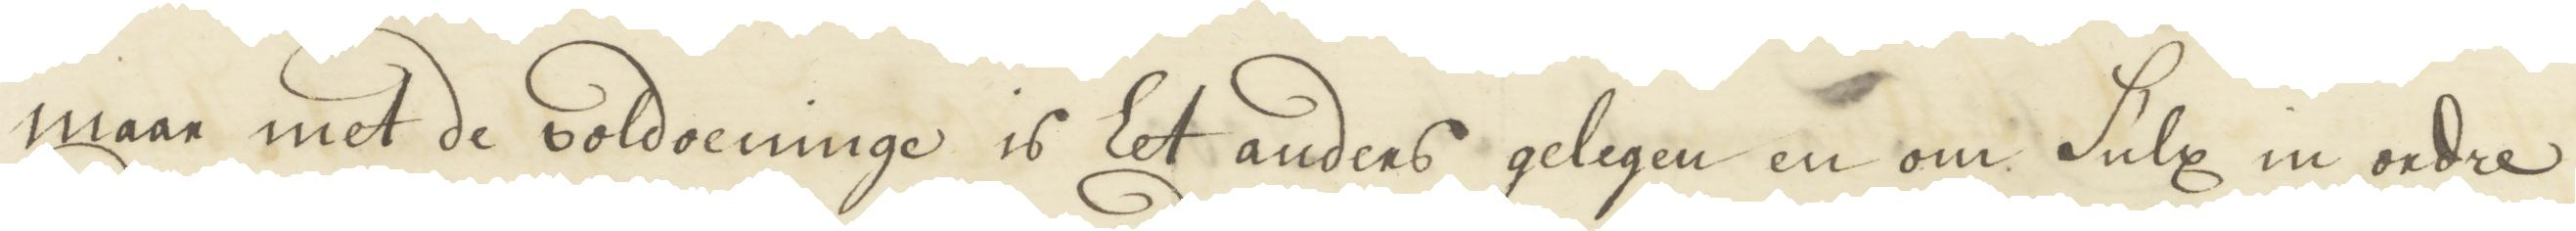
maar met de voldoeninge is het anders gelegen en om sulx in ordre
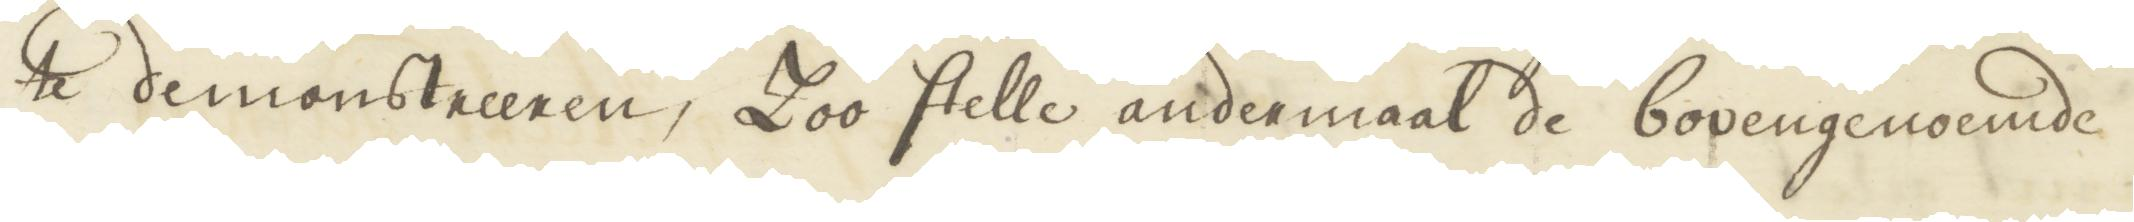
te demonstreeren, zoo stelle andermaal de bovengenoemde
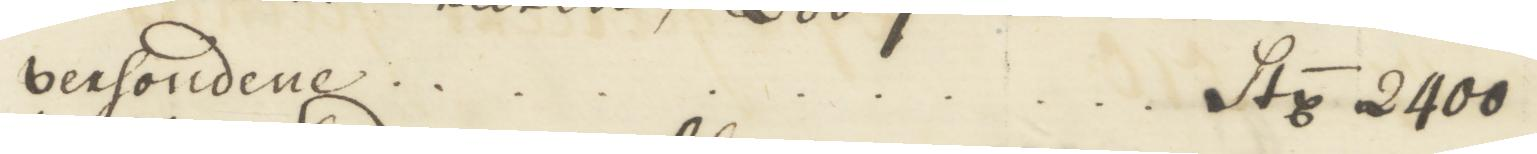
versondene - - - - - - - - - - - stx 2400
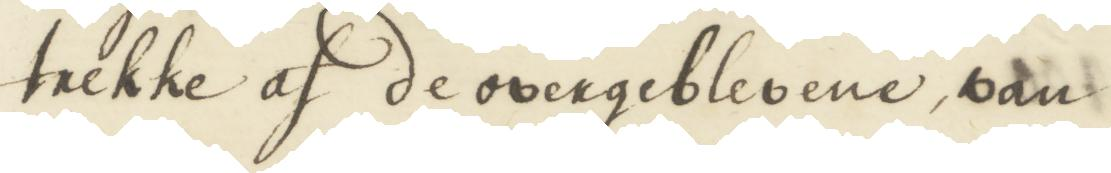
trekke af de overgeblevene, van
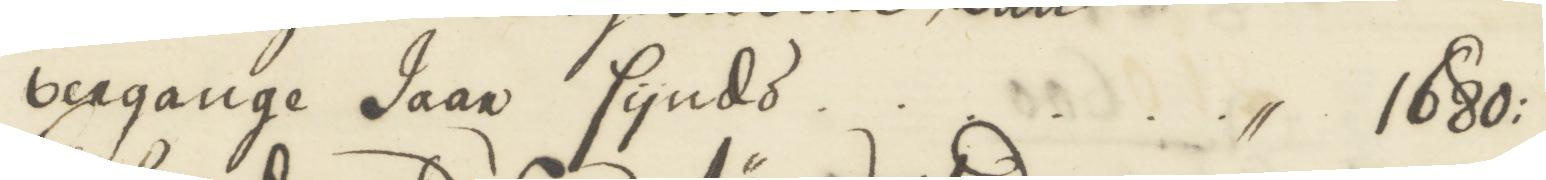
vergange Iaar sijnde - - - - - - „ 1680:
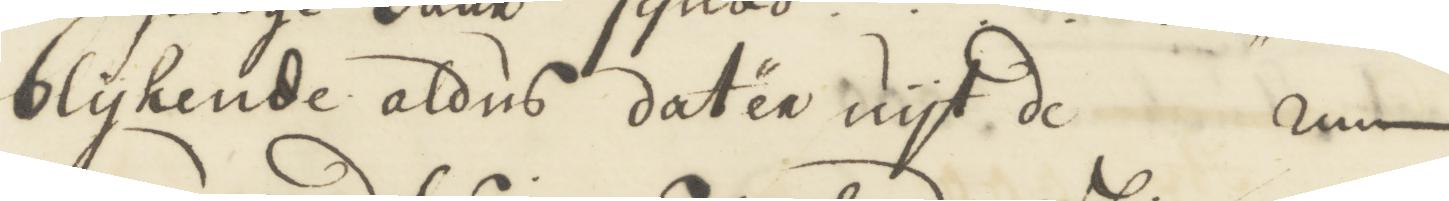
blijkende aldus dater uijt de —
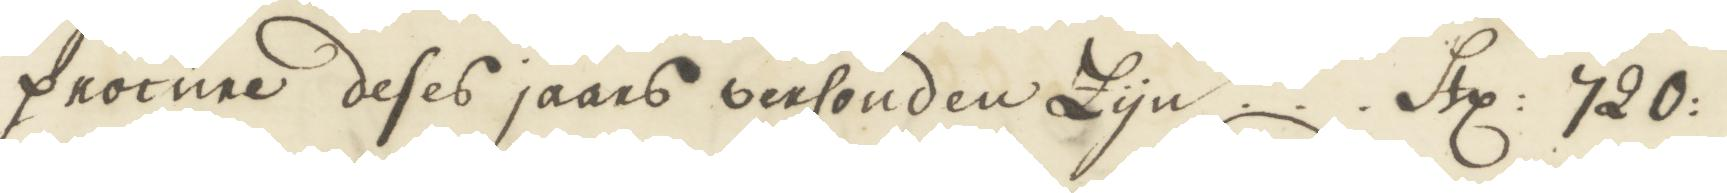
procure deses jaars versonden zijn - - - stx: 720:
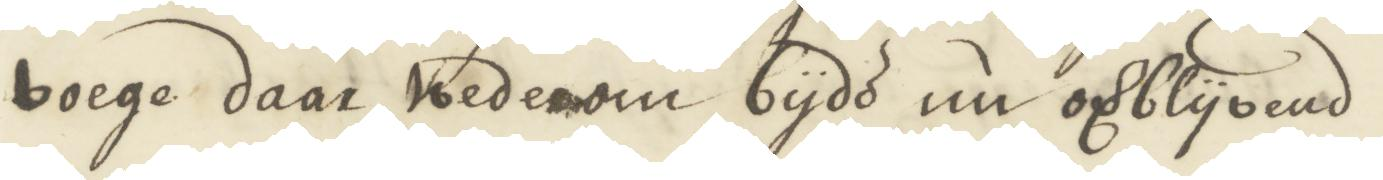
voege daar wederom bijde nu overblijvend
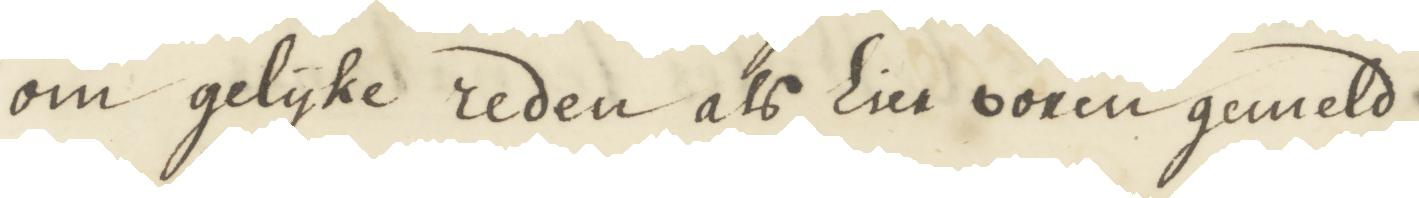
om gelijke reden als hier voren gemeld
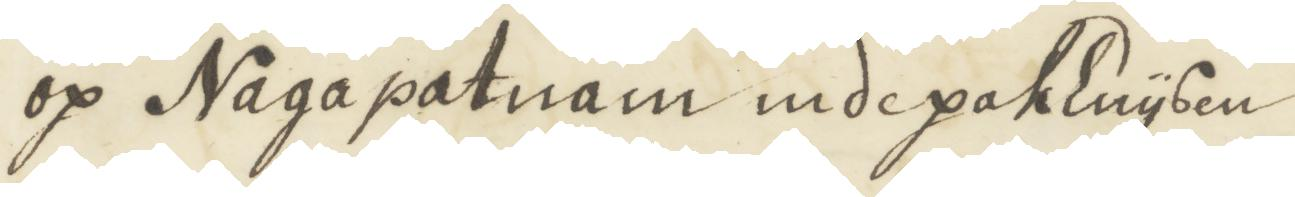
op Nagapatnam in de pakhuijsen
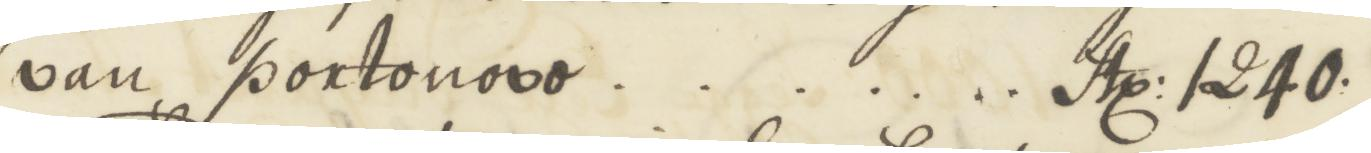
van portonovo - - - - - - - stx: 1240:
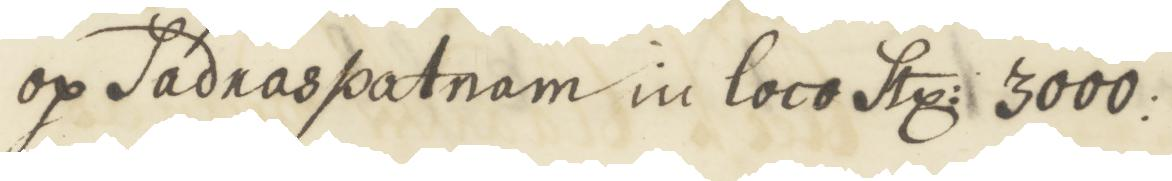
op Sadraspatnam in loco stx: 3000:
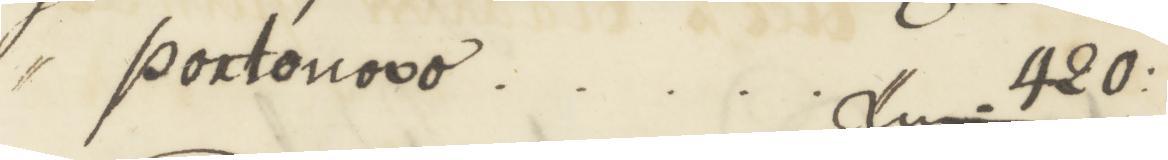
„ portonovo - - - - - „ 420:
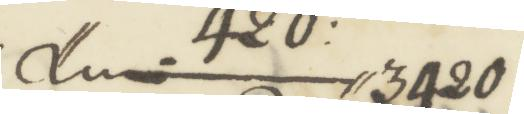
— „ 3420
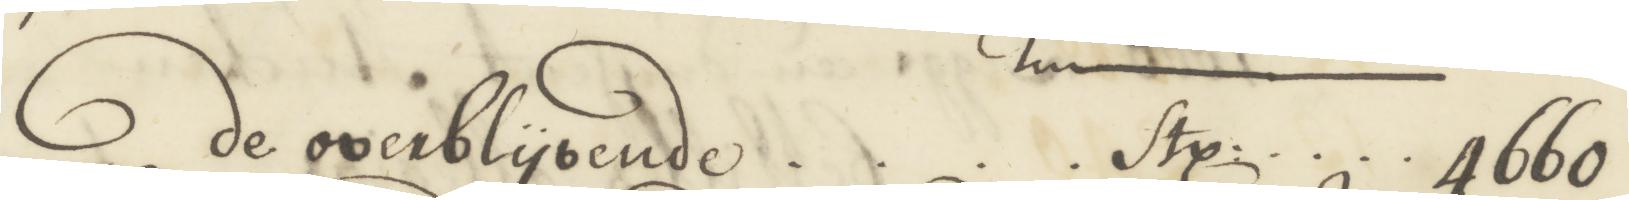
de overblijvende - - - - stx: - - - - 4660
